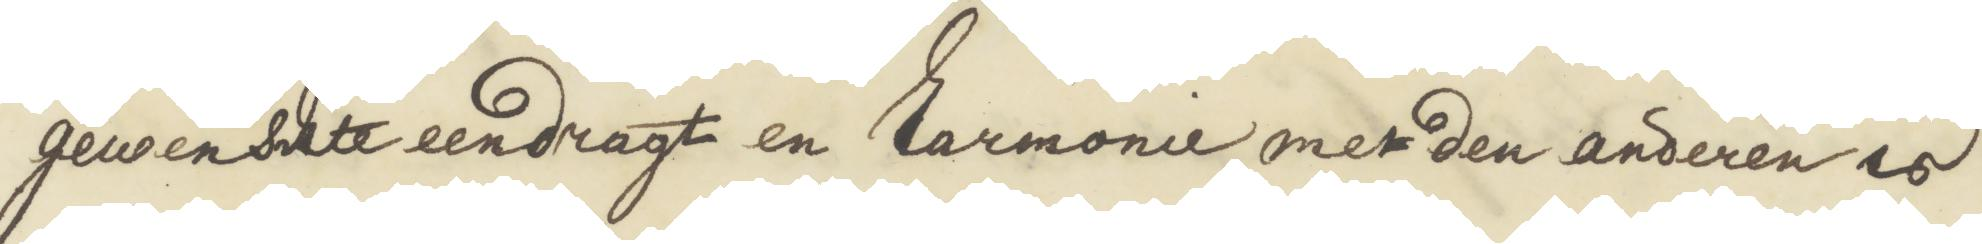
gewenschte eendragt en harmonie met den anderen is
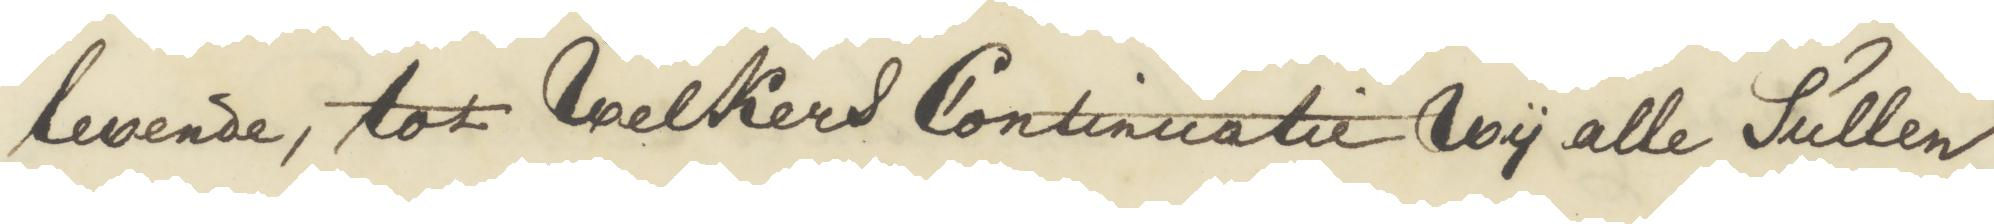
levende, tot welkers continuatie wij alle sullen
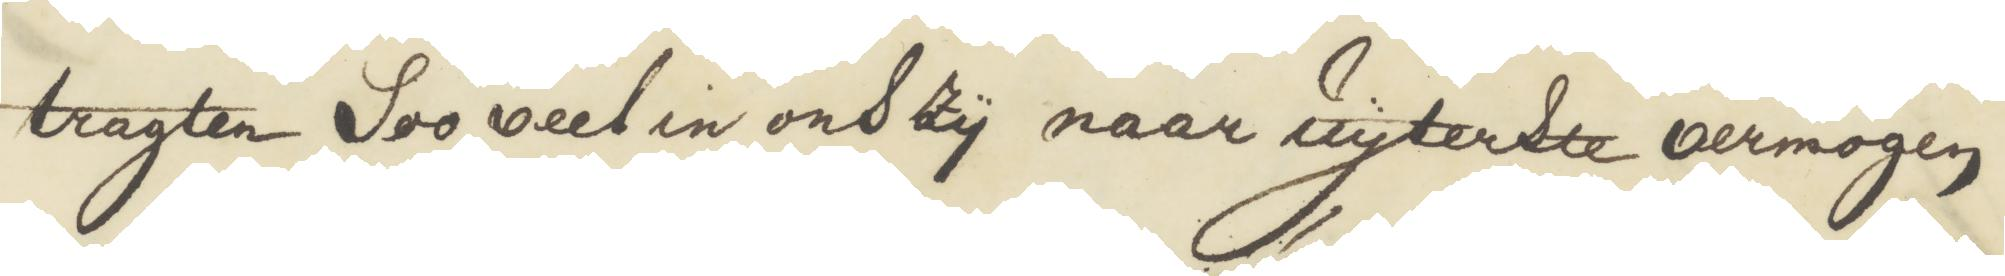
tragten soo veel in ons zij naar uijterste vermogen
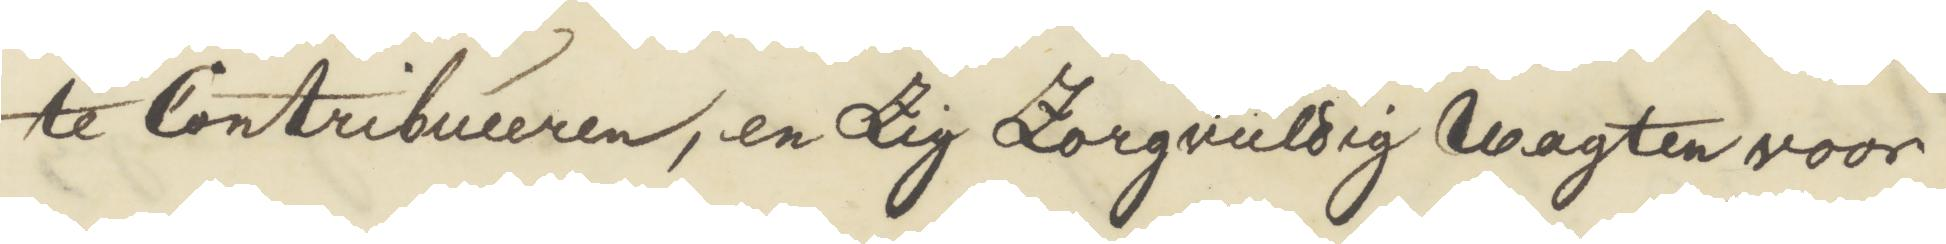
te contribueeren, en zig zorgvuldig wagten voor
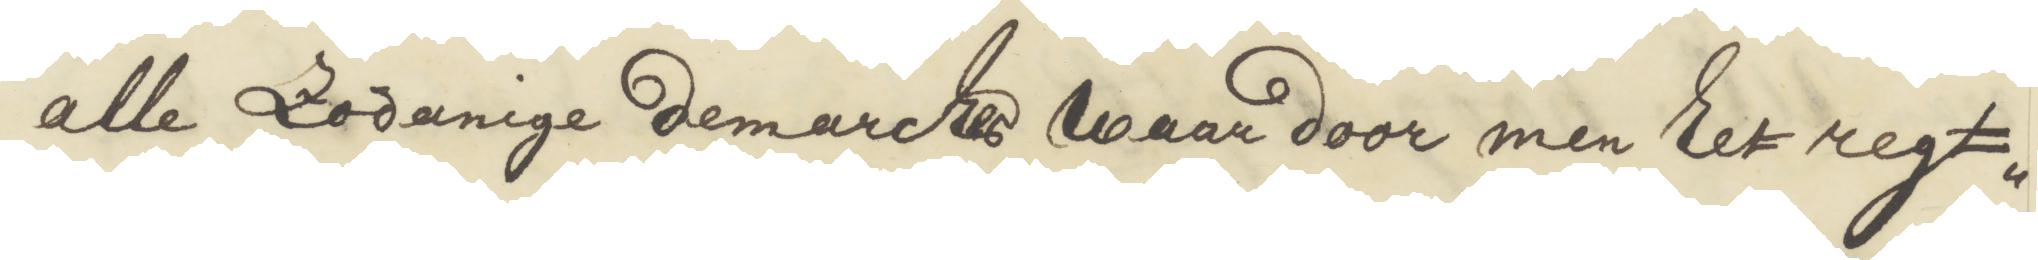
alle zodanige demarche waar door men het regt„
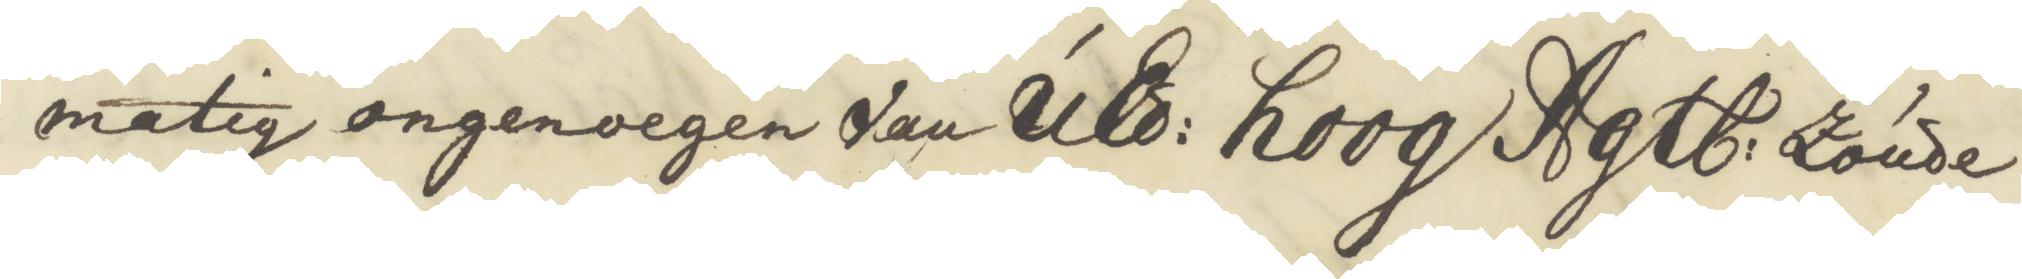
matig ongenoegen van UEd: hoog Agtb: zoude
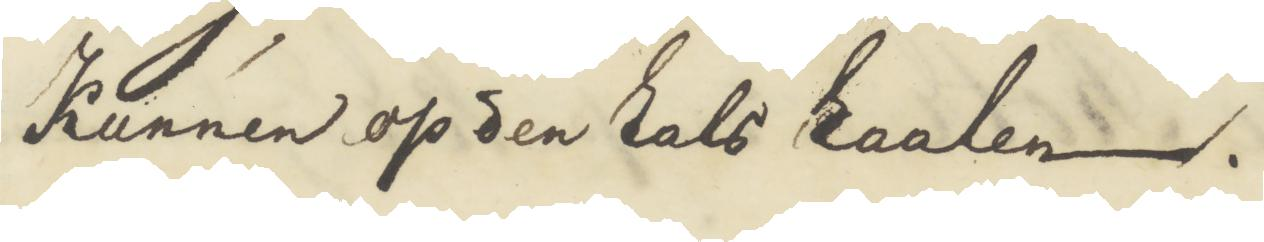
kunnen op den hals haalen.
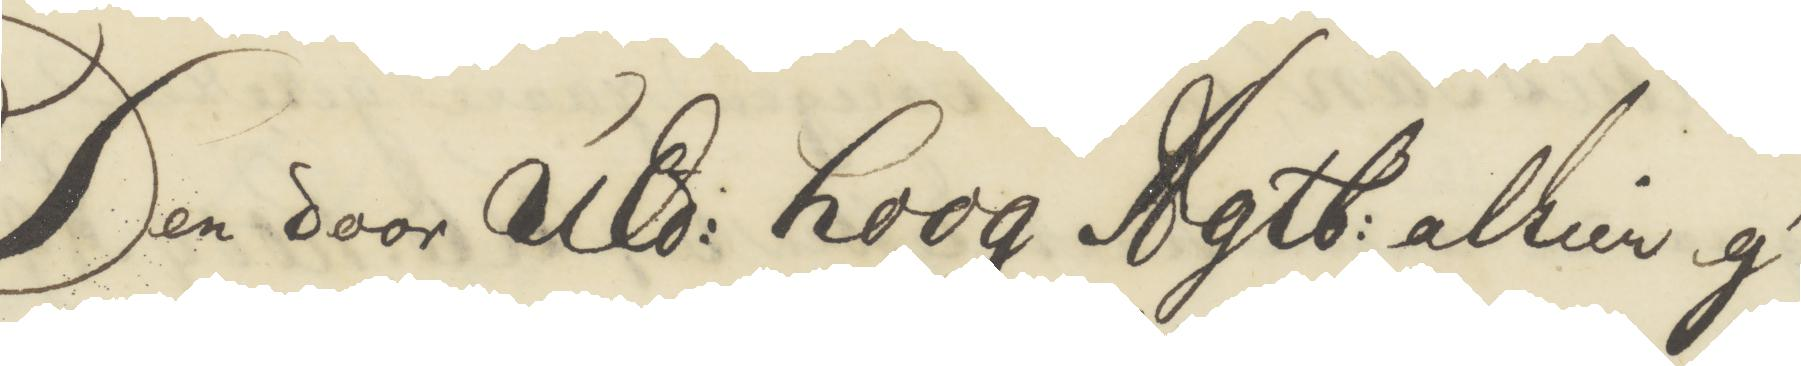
Den door UEd: hoog Agtb: alhier g'
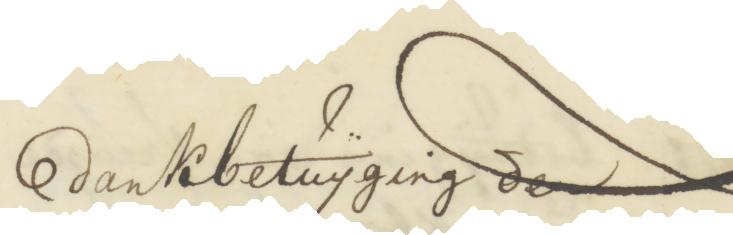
dankbetuijgieng den
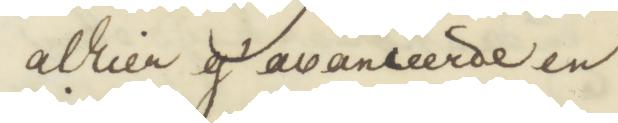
alhier g'avanceerde en
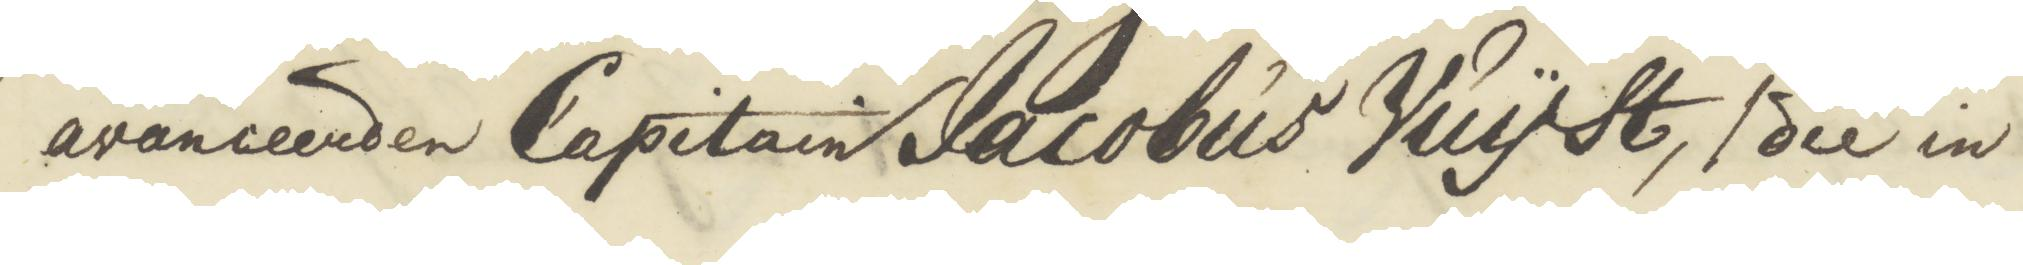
avanceerden Capitain Jacobus Vuijst, /die in
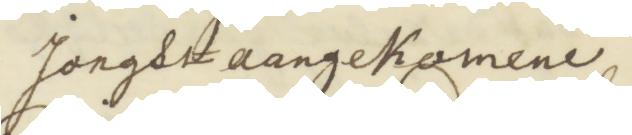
jongst aangekomene
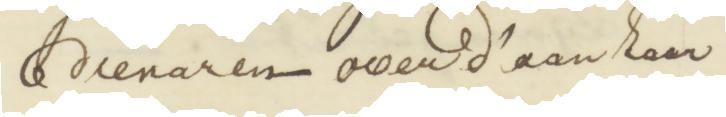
dienaren over d’aan haar
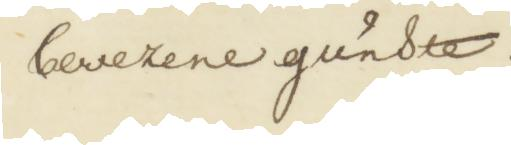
bewezene gunste.
